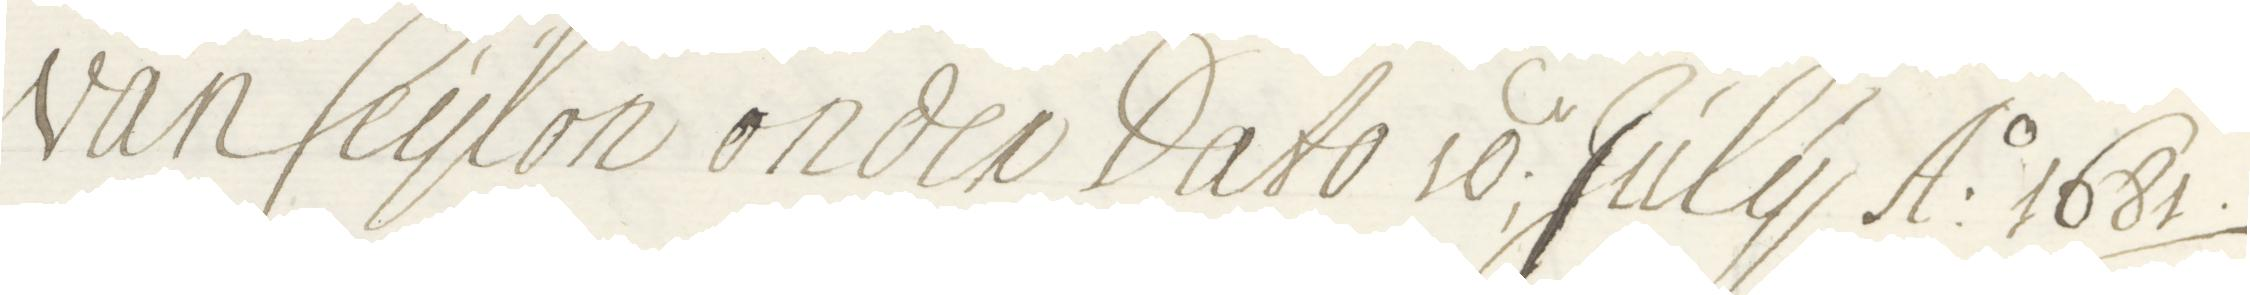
Van Ceijlon onder Dato 10:en Julij A:o 1681.
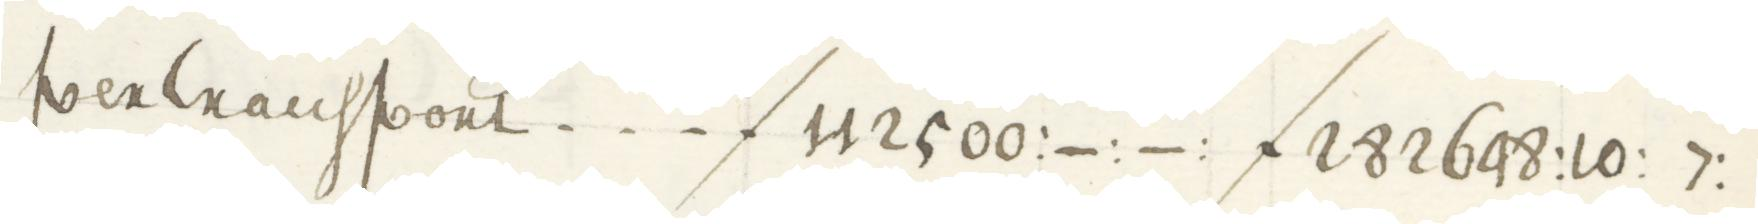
per transport - - - ƒ 112500: —: —: ƒ 282648: 10: 7:
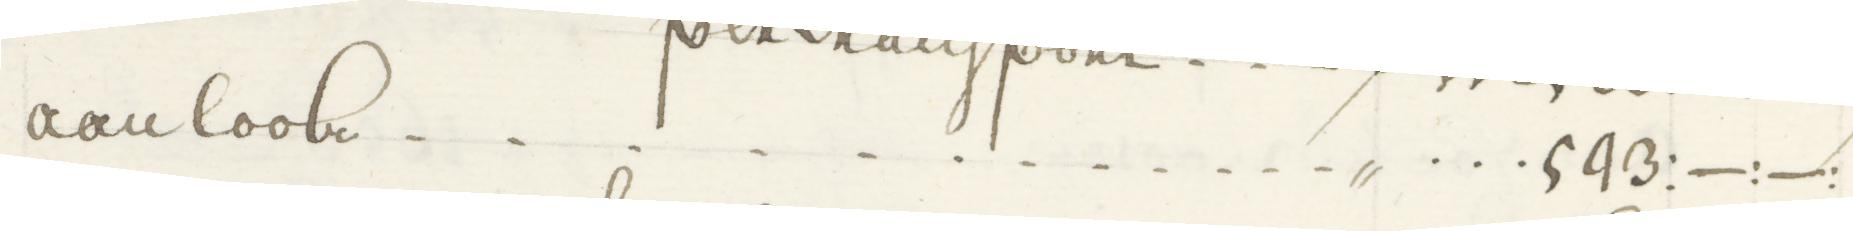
aan look - - - - - - - - - - - - - „ . . .543: —: —:
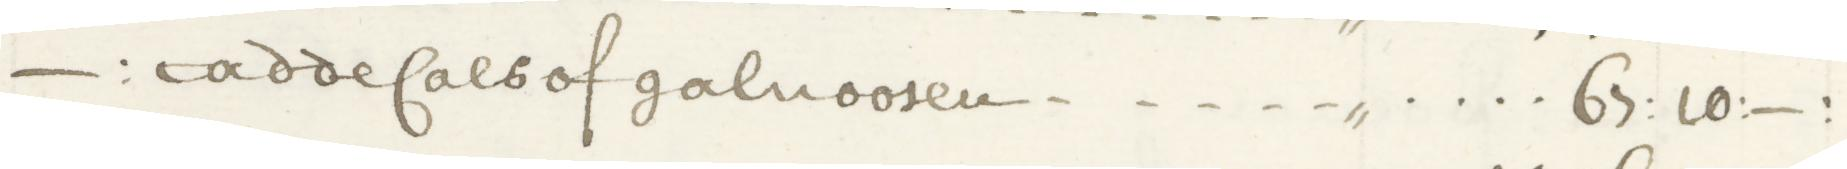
—: cadde Cals of galnooten - - - - - „. . . . 67: 10: —:
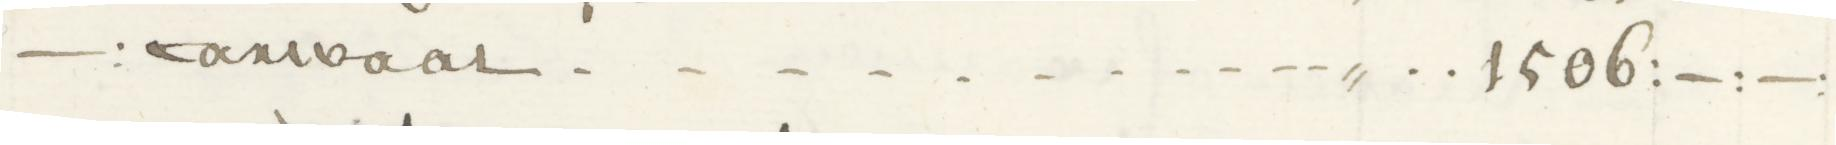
—: carwaat - - - - - - - - - - - - „ . .1506: —: —:
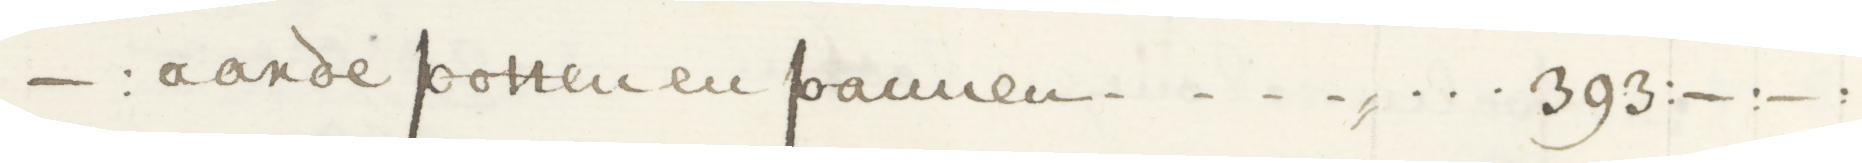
—: aarde potten en pannen - - - - „ . . .393: —: —:
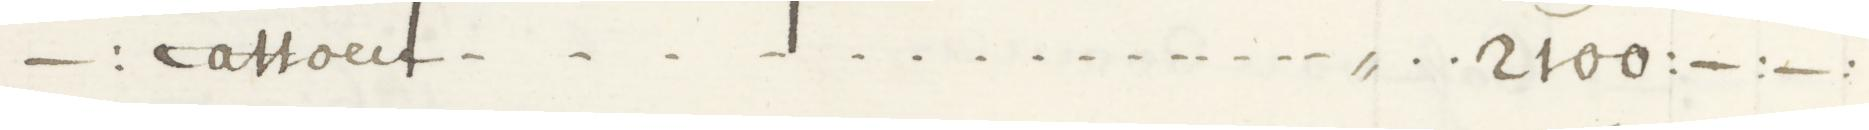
—: cattoen - - - - - - - - - - - - - - - „ . . 2100: —: —:
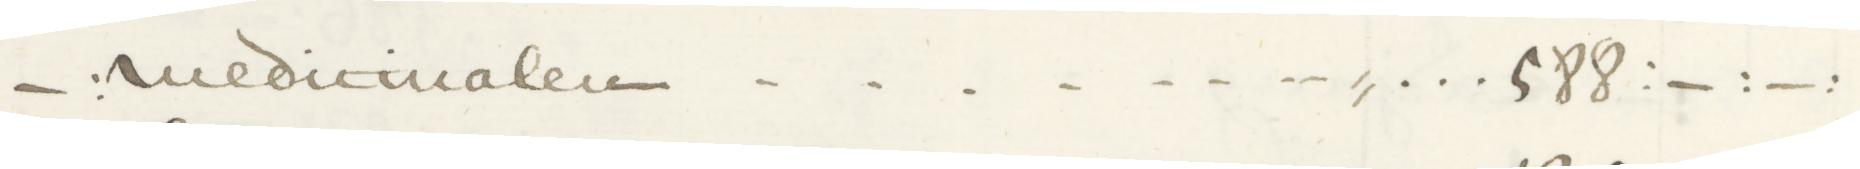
—: medicinalen - - - - - - - „ . . . . 588: —: —:
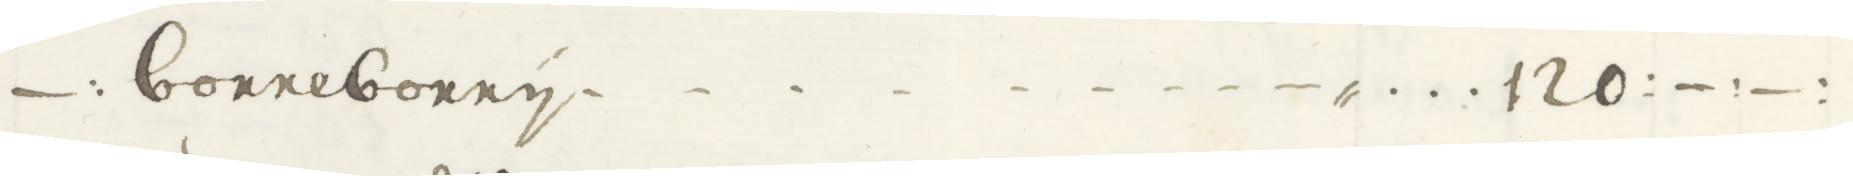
—: borreborrij - - - - - - - - „ . . . 120: —: —:
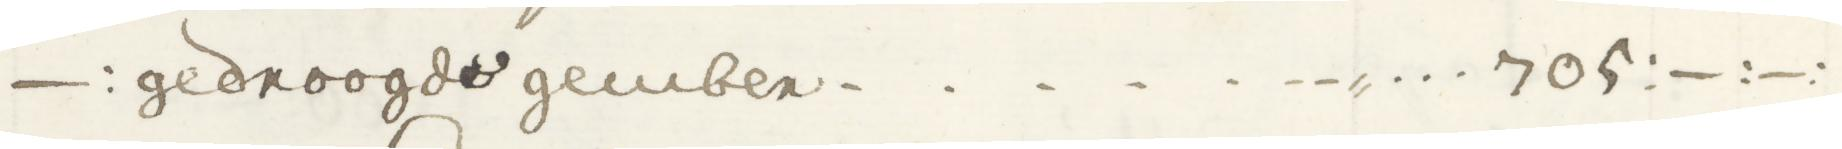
—: gedroogde gember - - - - - - - „ . . . 705: —: —:
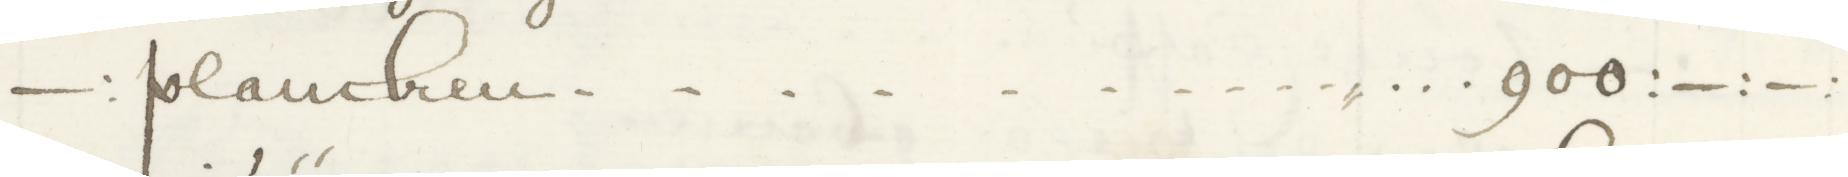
—: plancken - - - - - - - - - „ . . .900: —: —:
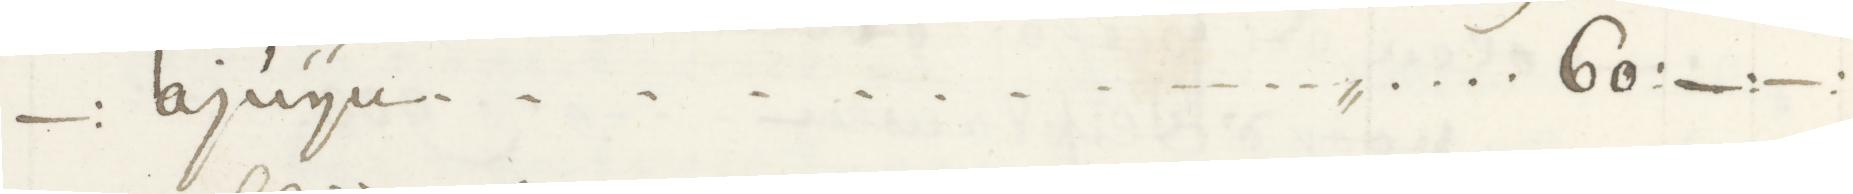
—: ajuijn - - - - - - - - - - - -„ . . . . 60: —: —:
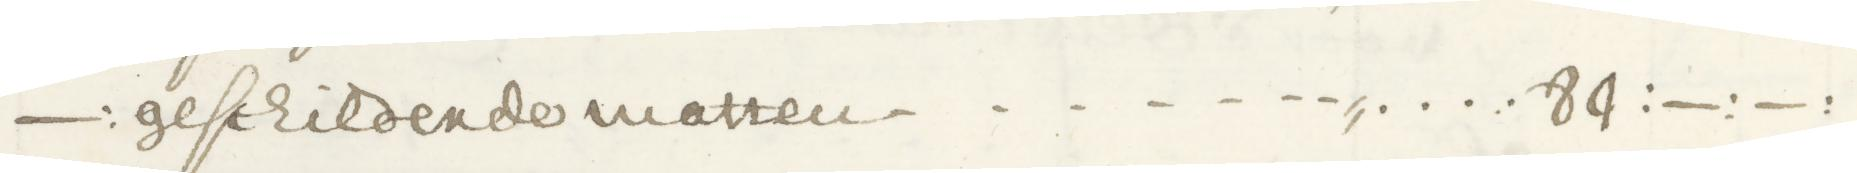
—: geschilderde matten - - - - - - - „ . . . . 84: —: —:
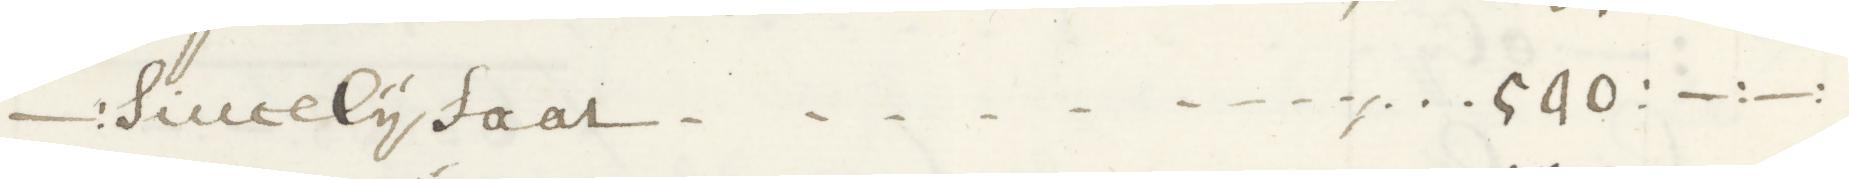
—: Sincelij Saat - - - - - - - - - -„ . . .540: —: —:
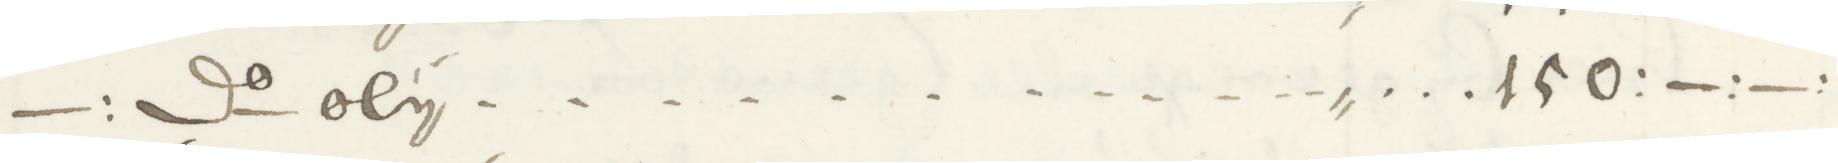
—: D-o olij - - - - - - - - - - - - - „ . . .150: —: —:
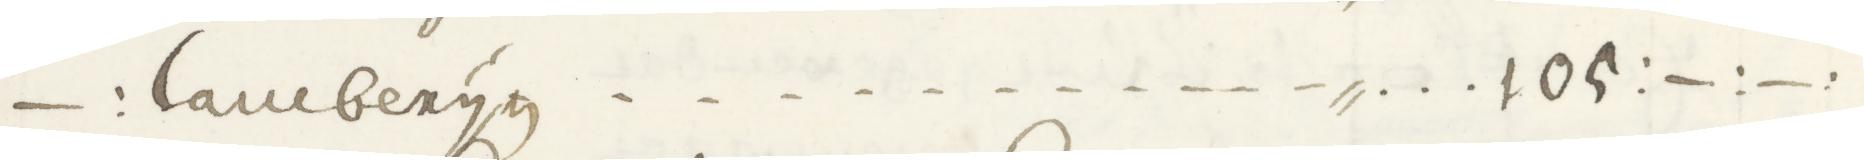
—: tamberijn - - - - - - - - - - - - „ . . . 105: —: —:
